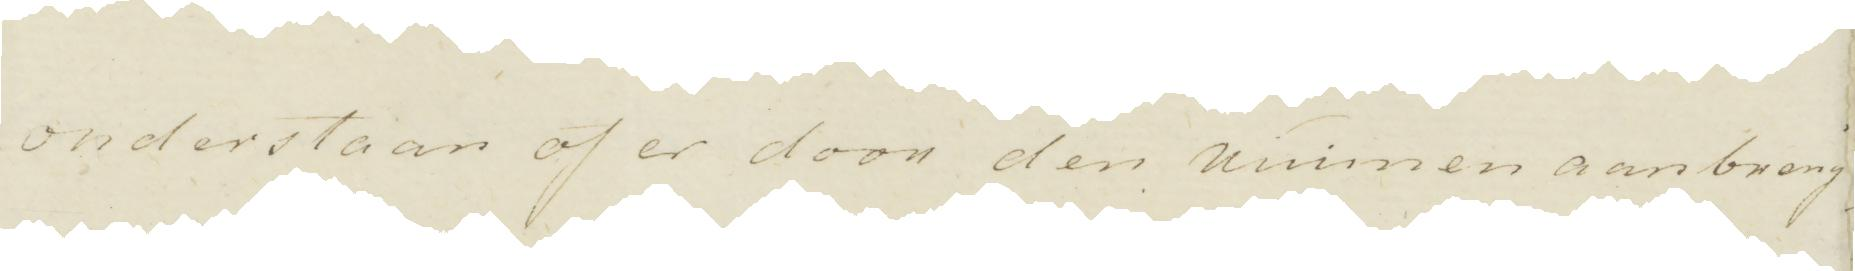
onderstaan of er door den ruimen aanbreng
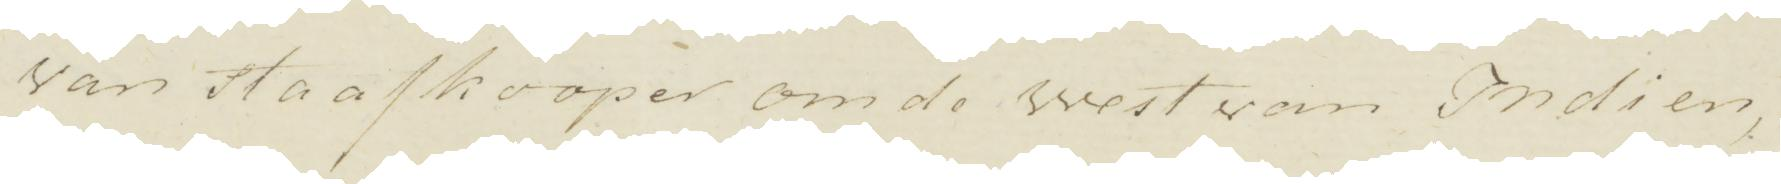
van staafkooper om de west van Indien,
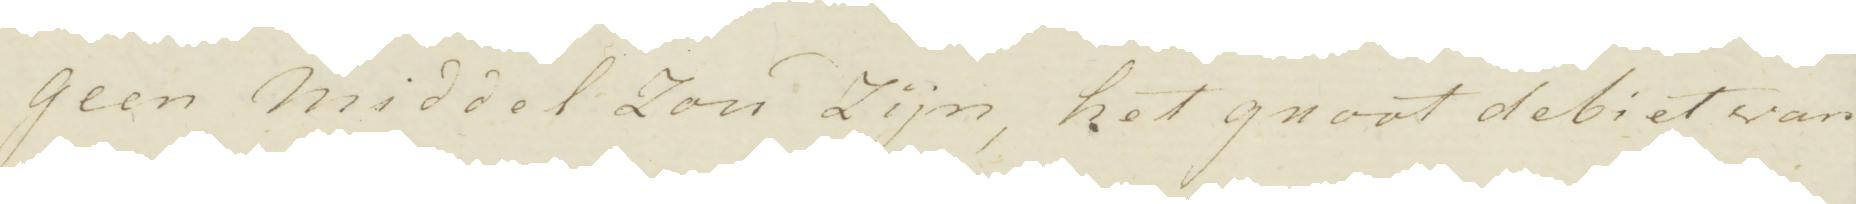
geen middel zou zijn, het groot debiet van
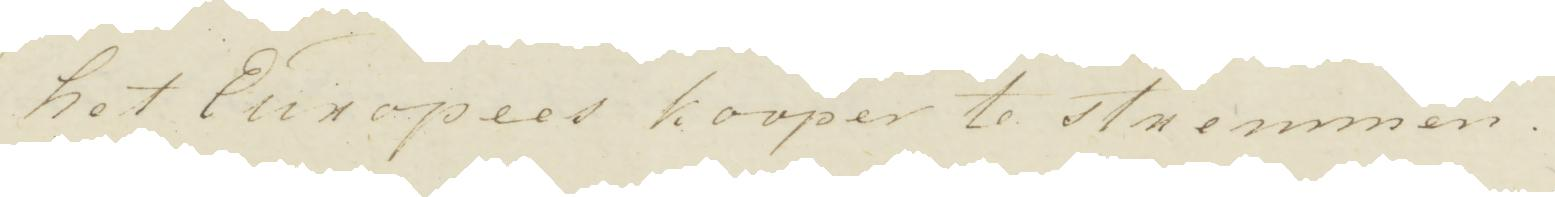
het Europees kooper te stremmen.
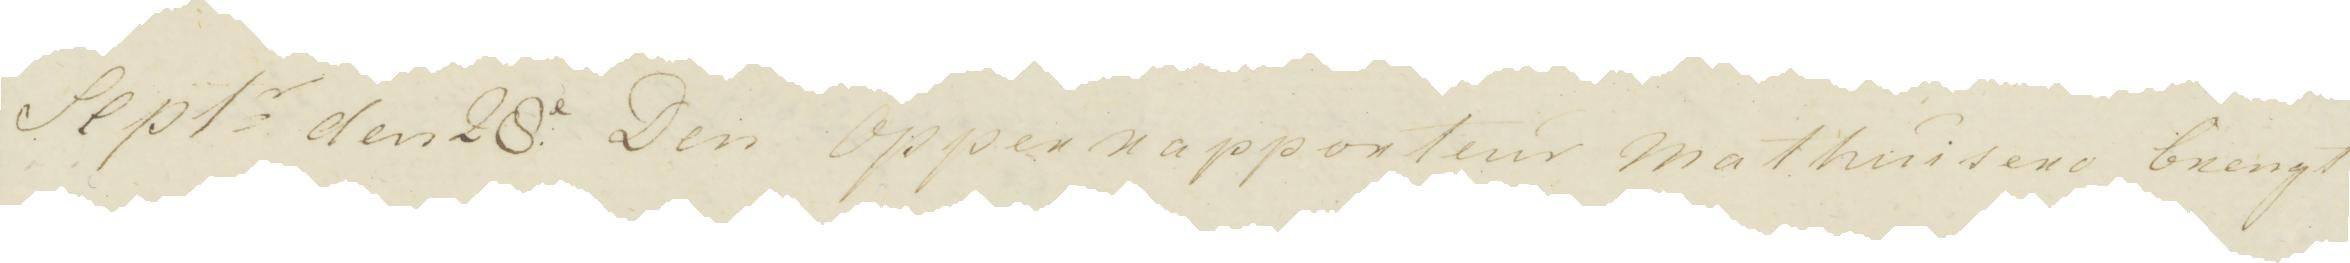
Sept=r den 28:e Den Opperrapporteur mathuisero brengt
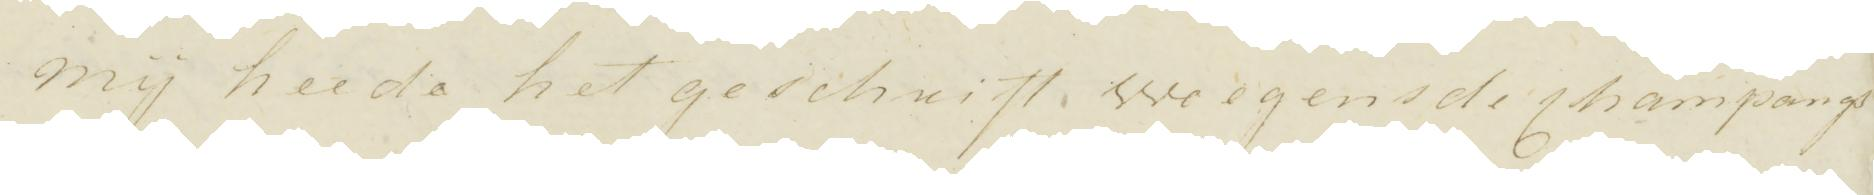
mij heede het geschrift weegens de Champangs
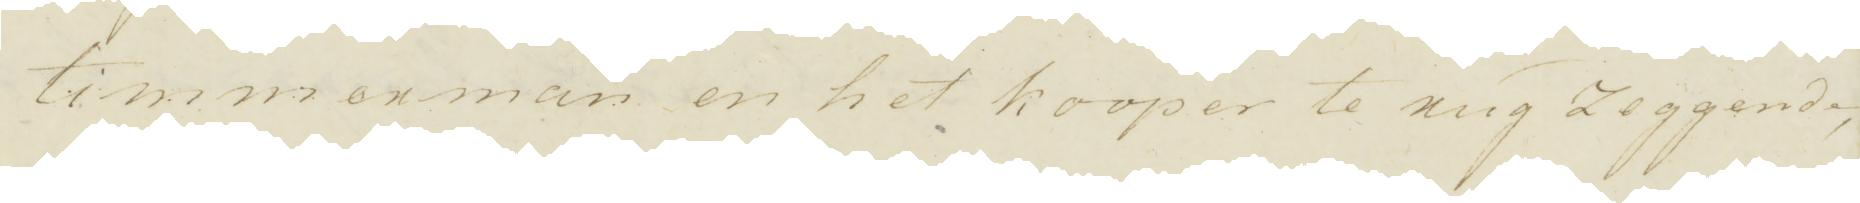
timmerman en het kooper te rug zeggende,
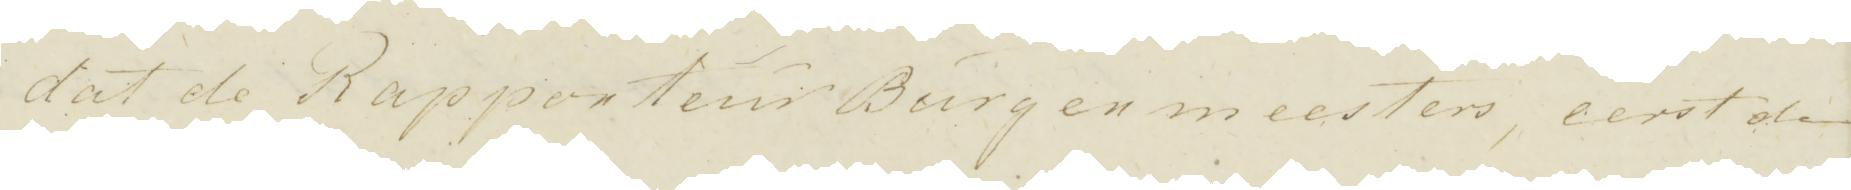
dat de Rapporteur Burgermeesters, eerst de
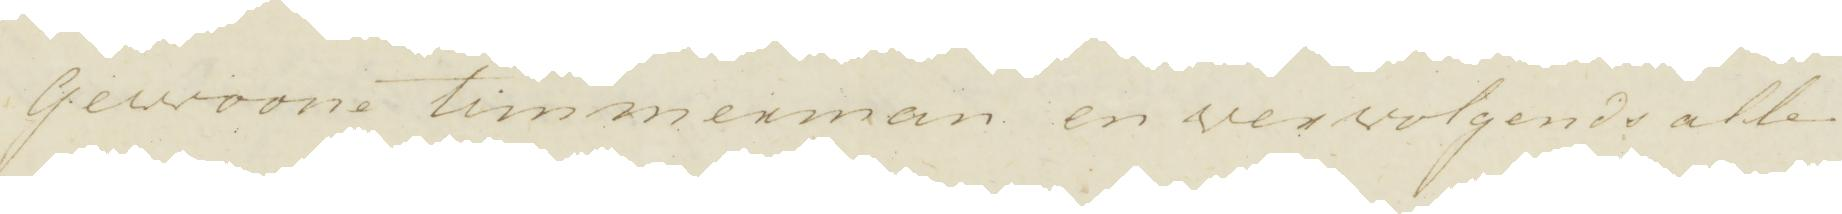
Gewoone timmerman en vervolgends alle
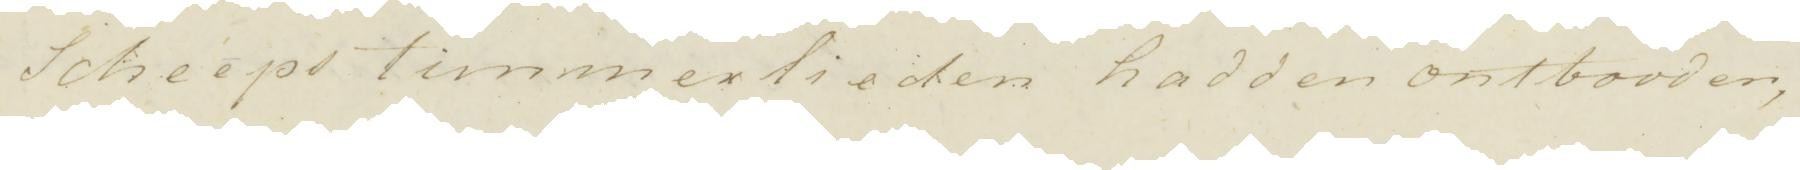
scheeps timmerlieden hadden ontbooden,
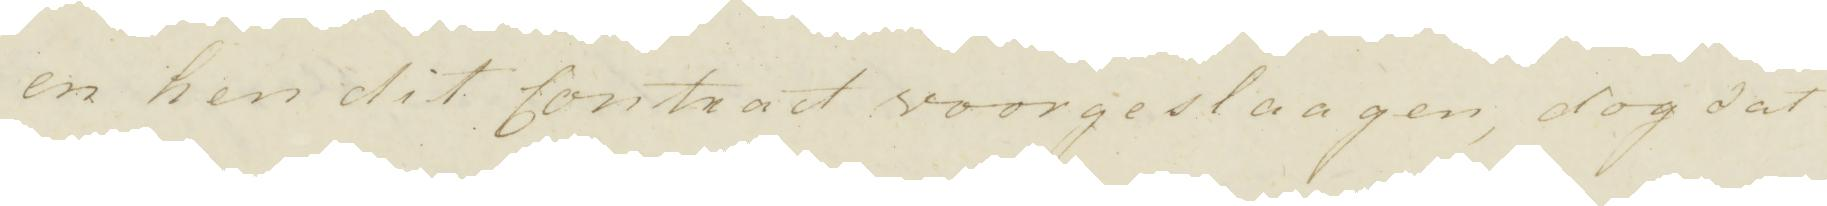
en hen dit Contract voorgeslaagen, dog dat
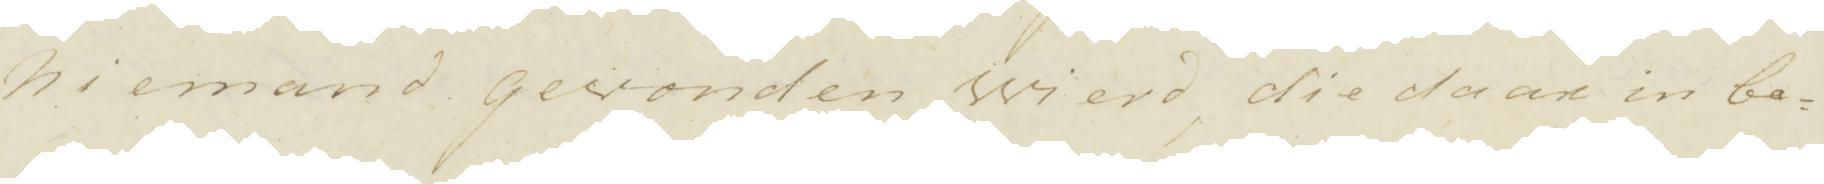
niemand gevonden wierd, die daar in be=
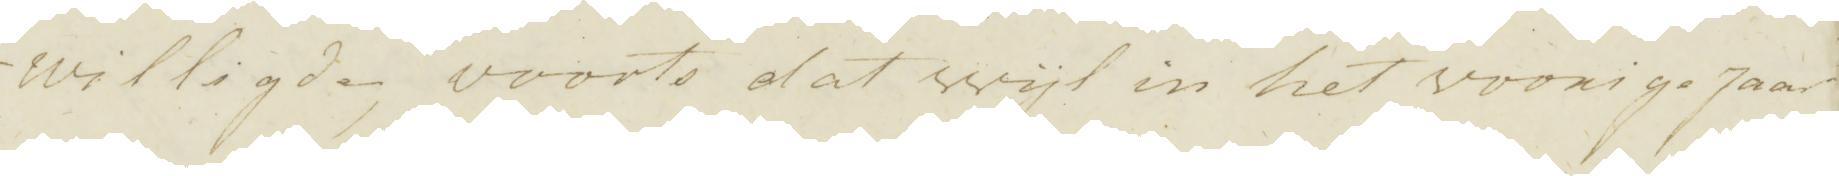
willigde, voorts dat wijl in het voorige jaar
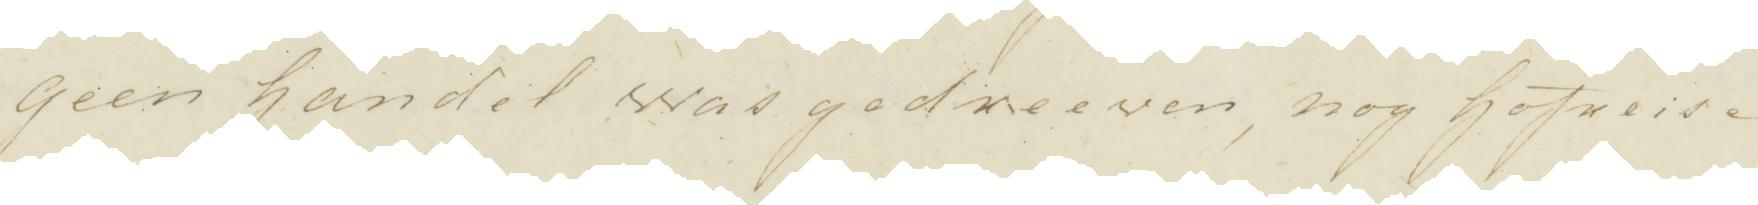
geen handel was gedreeven, nog hofreise
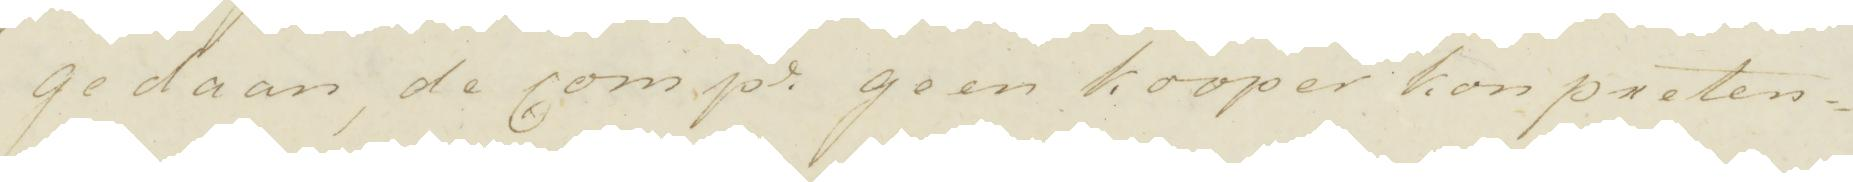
gedaan, de Comp.e geen kooper kon preten=
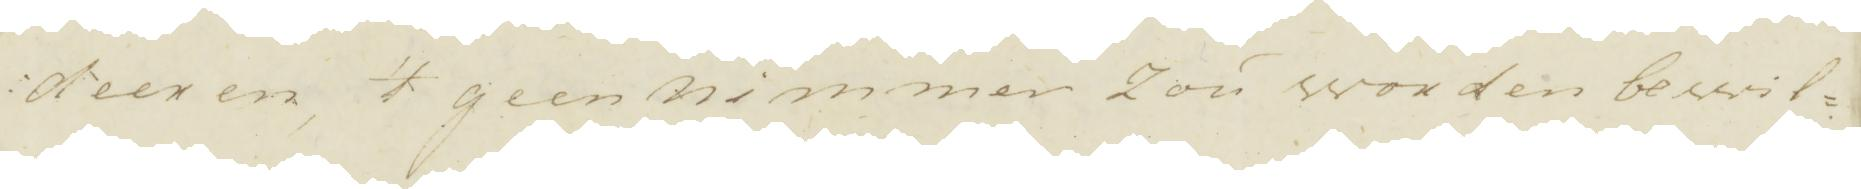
=deeren, ’t geen nimmer zou worden bewil=
